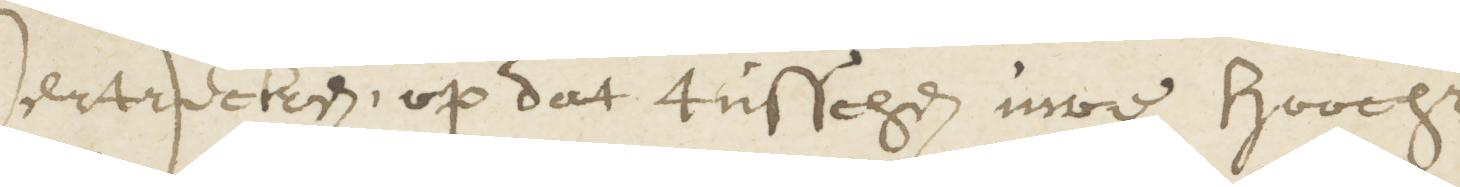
Vertrecken, op dat tusschen uwe hoochh
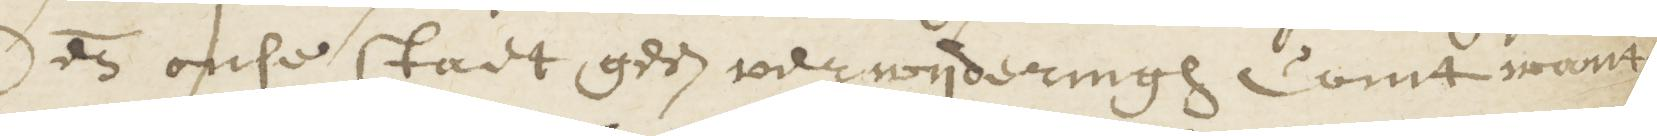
ende onse staet geen verwyderingh Comt want
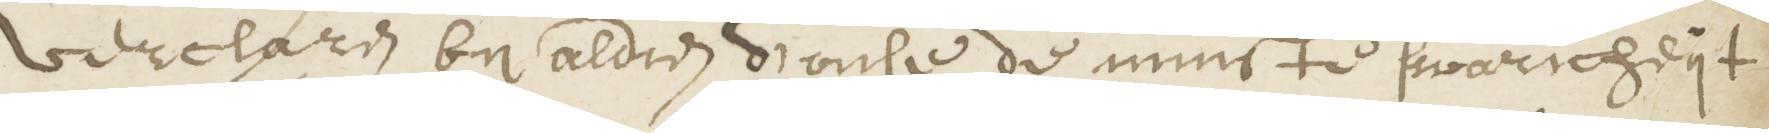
verclaren by aldien d'onse de minste swaricheijt
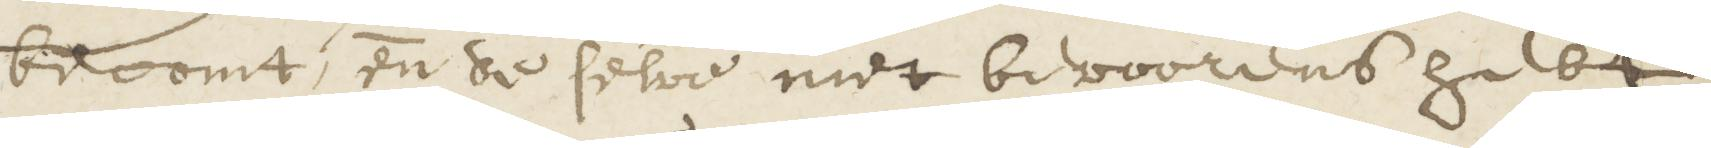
becomt, ende de selve niet bevoorens hebt
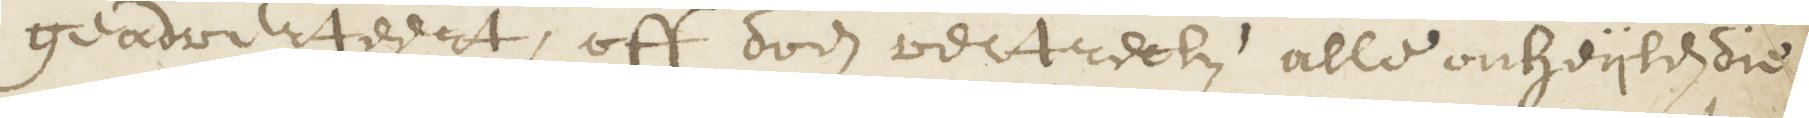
geadverteert, off doen vertreck' alle onheijlen die
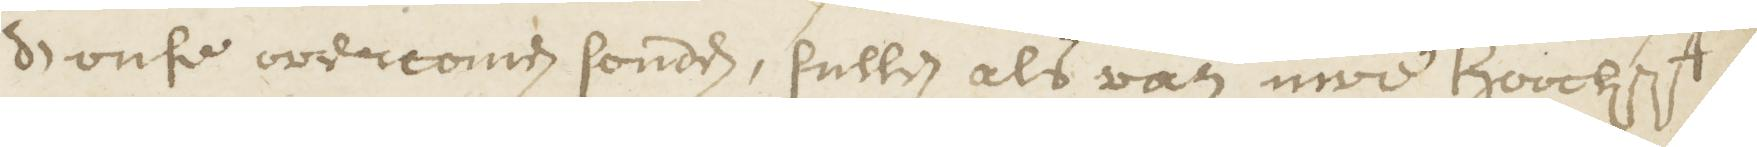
d'onse overcomen souden, sullen als van uwe hoochy.t
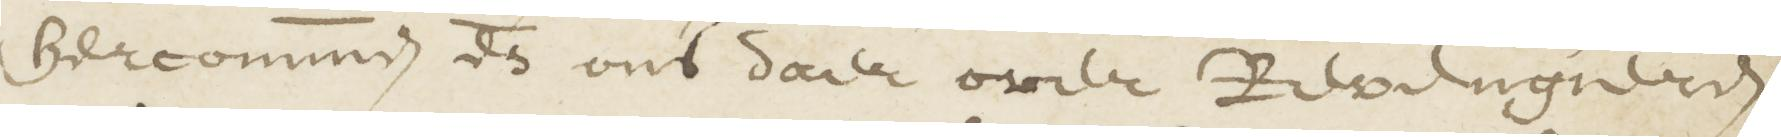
hercommen ende ons daer over Revengieren
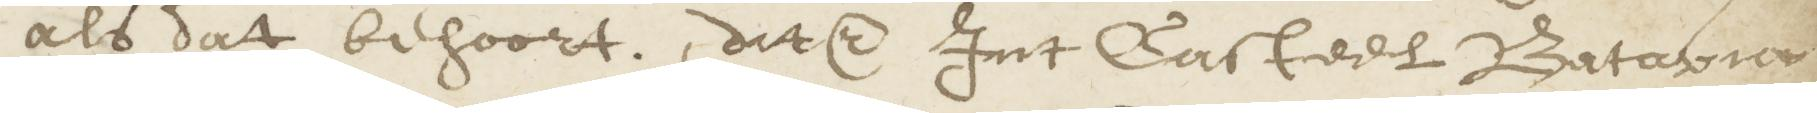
als dat behoort. , dit ende Jnt Casteel Batavia
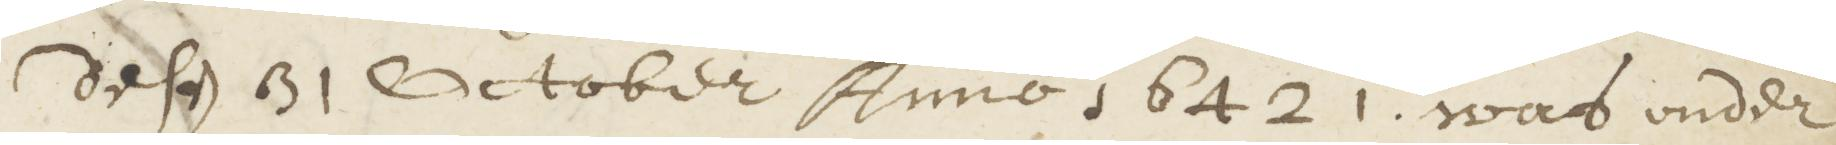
desen 31 October Anno 1621. was onder
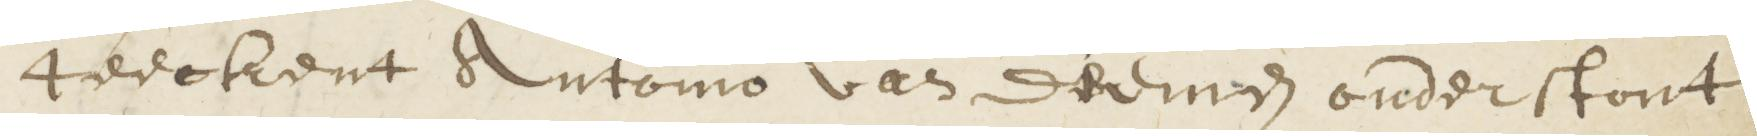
teeckent Antonio van diemen onderstont
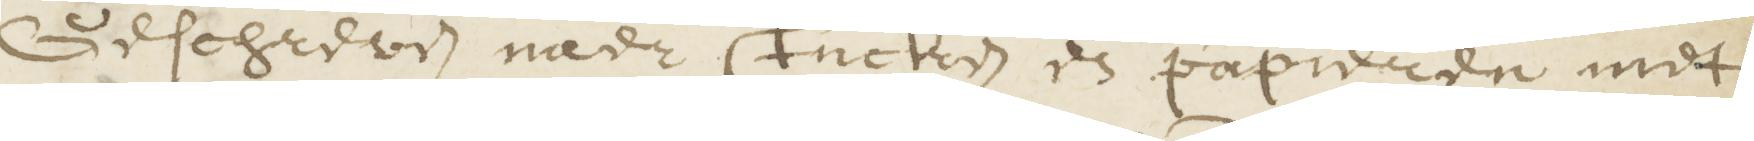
geschreven neer stucken ende papieren met
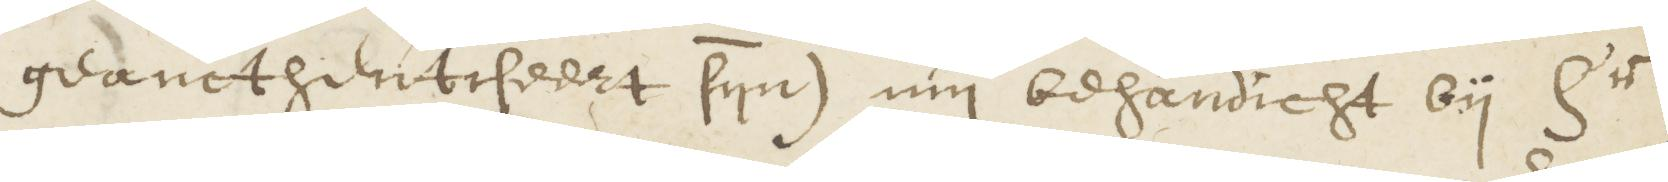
geancthentiseert syn) mij behandicht bij h'r
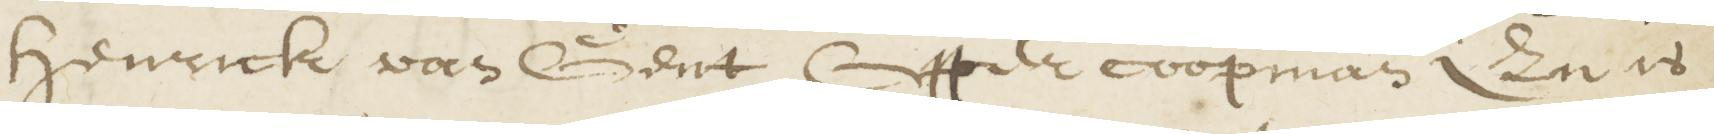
henrick van Gent Oppercoopman En is
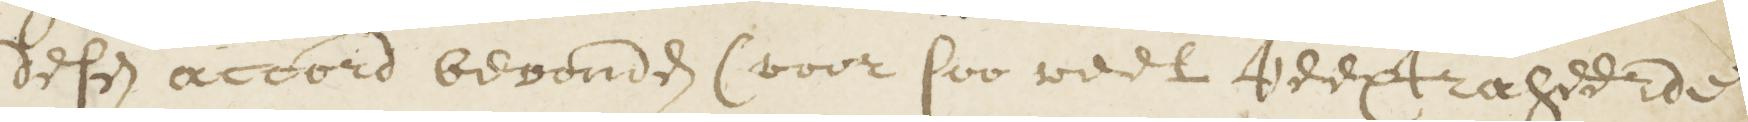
desen accord bevonden ( voor soo veel t'eextraheerde
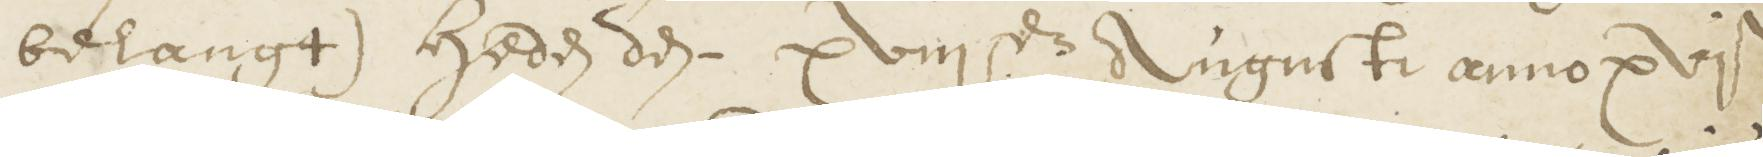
belangt ) heden den - xviij.en Augusti anno xvije
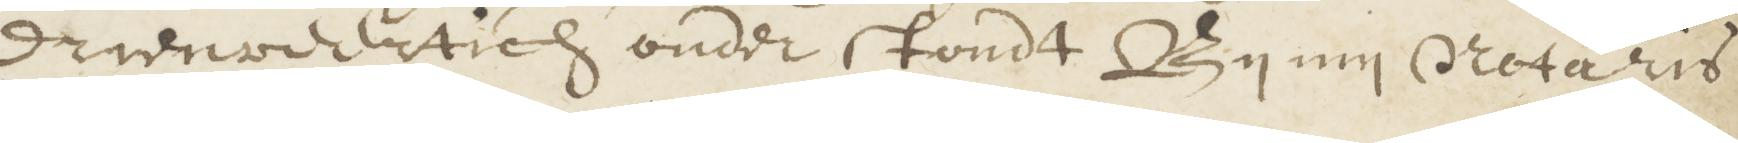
drienveertich onder stondt By my Notaris
